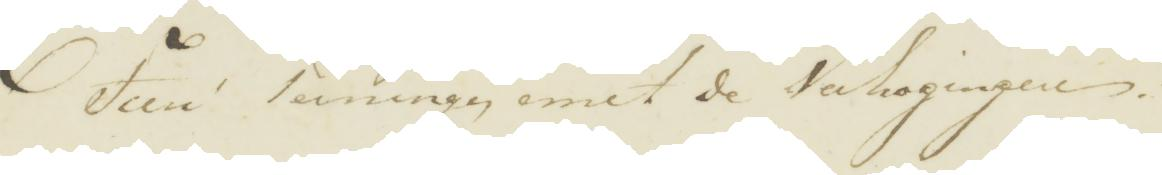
Tien' Penningen de Verhogingen.
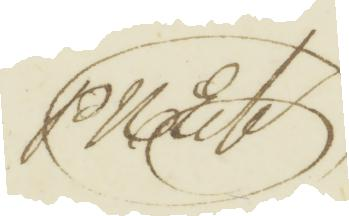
P U. Else
